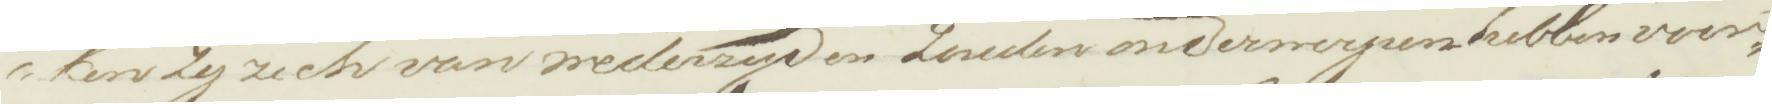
„ken zy zich van wederzyden zouden onderwerpen hebben voor„
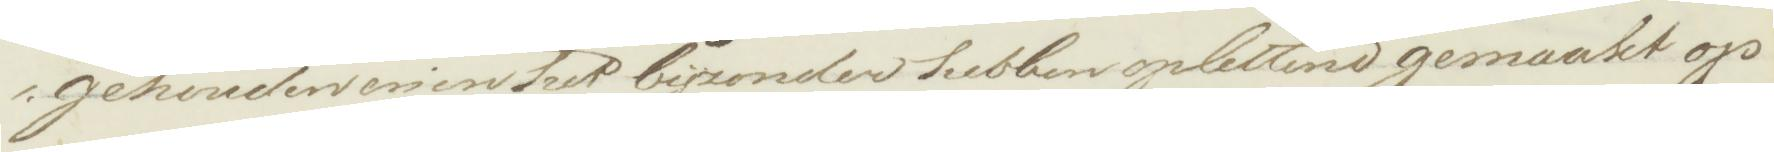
„gehouden en in het bijzonder hebben oplettend gemaakt op
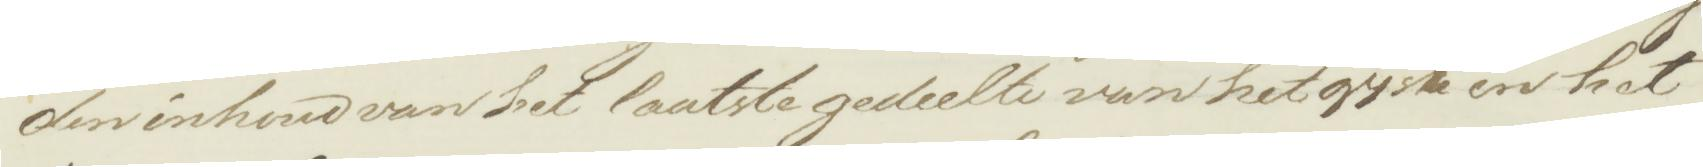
den inhoud van het laatste gedeelte van het 97ste en het
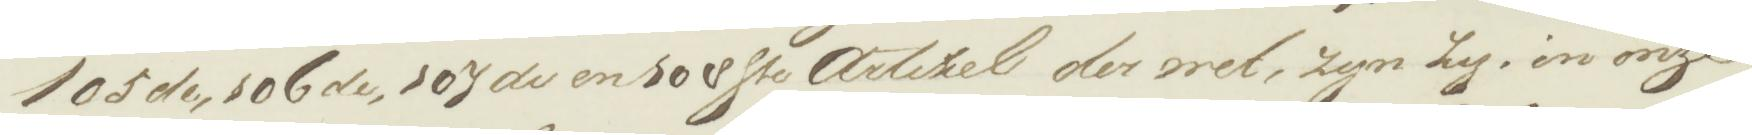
105de, 106de, 107de en 108ste Artikel der wet, zyn zy, in onze
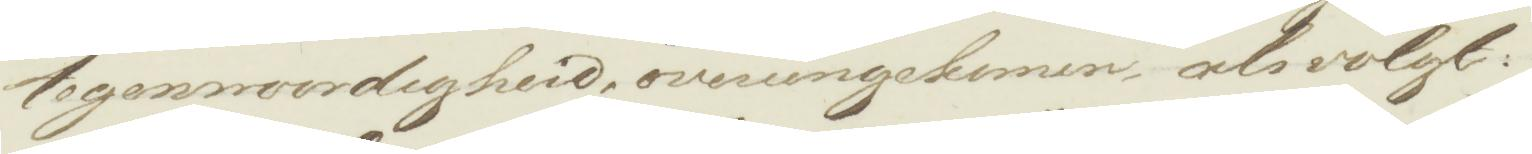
tegenwoordigheid, overeengekomen, als volgt:
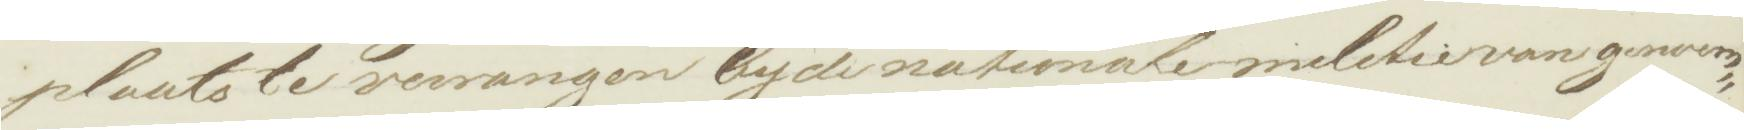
plaats te vervangen by de nationale militie van genoem„
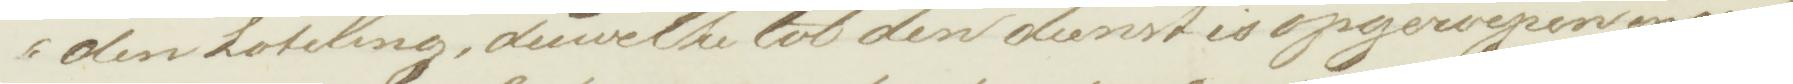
„den Loteling, dewelke tot den dienst is opgeroepen en aan
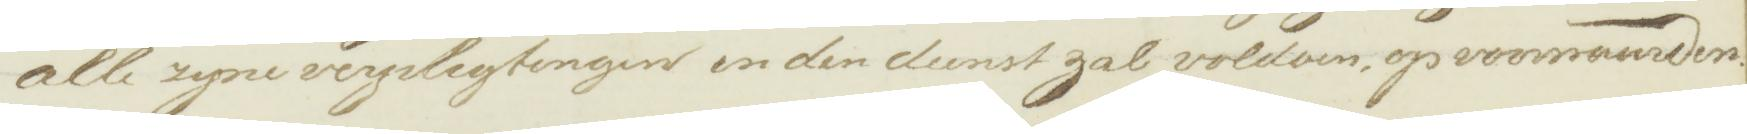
alle zyne verpligtingen in den dienst zal voldoen, op voorwaarden
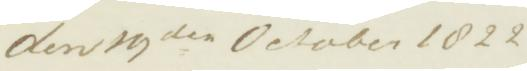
den 19 den October 1822
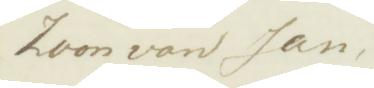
zoon van Jan,
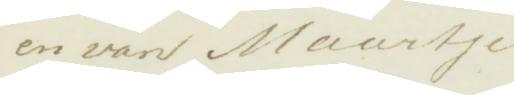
en van Maartje
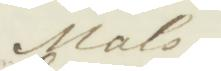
Mals
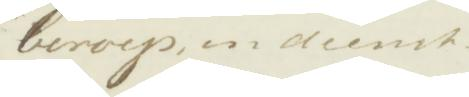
beroep, in dienst.
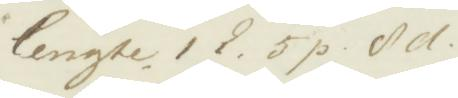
lengte, 1E. 5p. 8d.
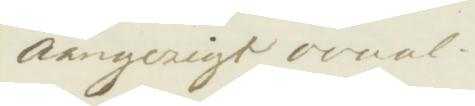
aangezigt, ovaal.
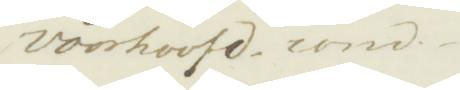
voorhoofd- rond.
